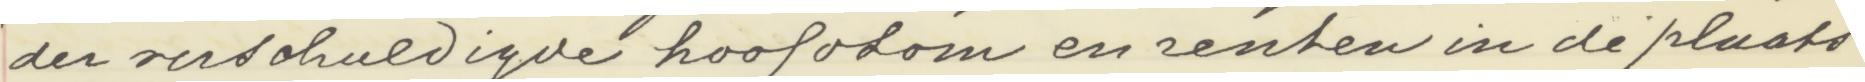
der verschuldigde hoofdsom en renten in de plaats
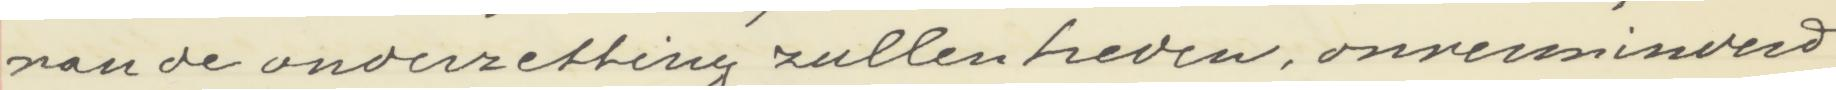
vande onderzetting zullen treden, onverminderd
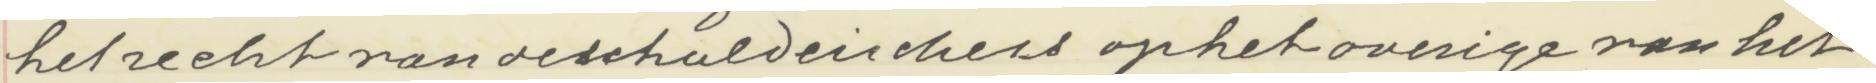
het recht van de schuldeischers op het overige van het
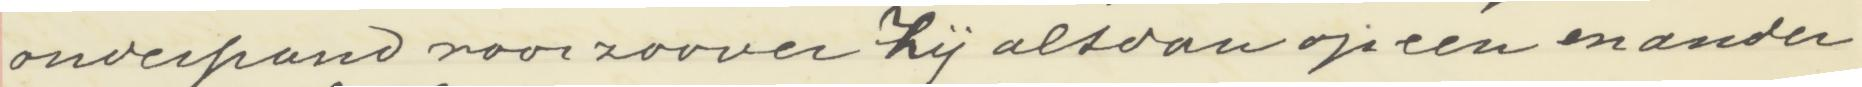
onderpand voor zoover zij alsdan op een en ander
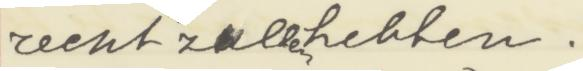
recht zullen hebben.
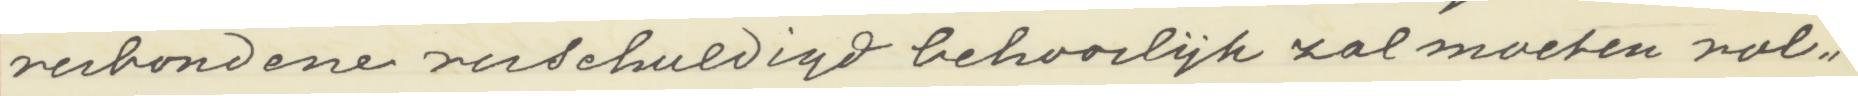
verbondene verschuldigd behoorlijk zal moeten vol„
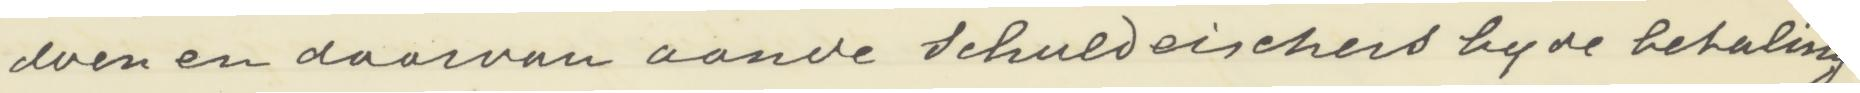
doen en daarvan aan de schuldeischers by de betaling
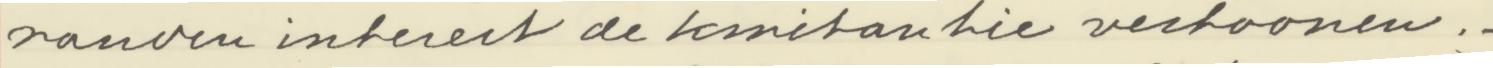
van den interest de kwitantie vertoonen.
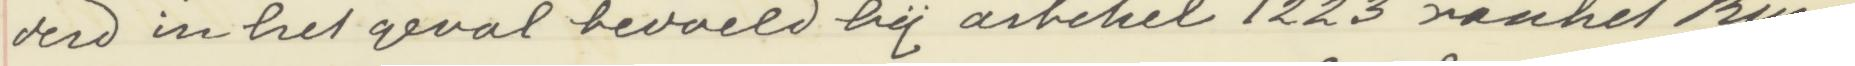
derd in het geval bedoeld bij artikel 1223 vanhet Bur
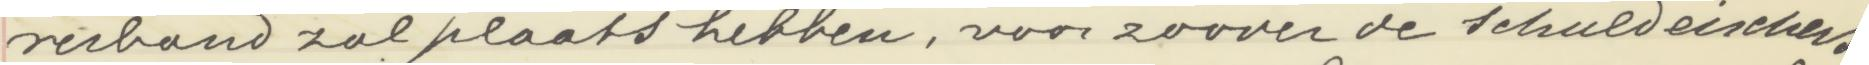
verband zal plaats hebben, voor zoover de schuldeischers
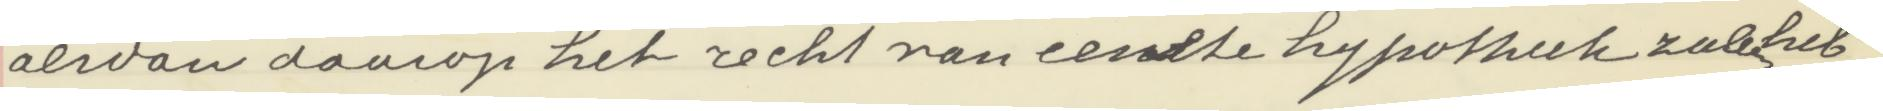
alsdan daarop het recht van eerste hypotheek zullen heb
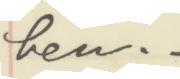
ben.
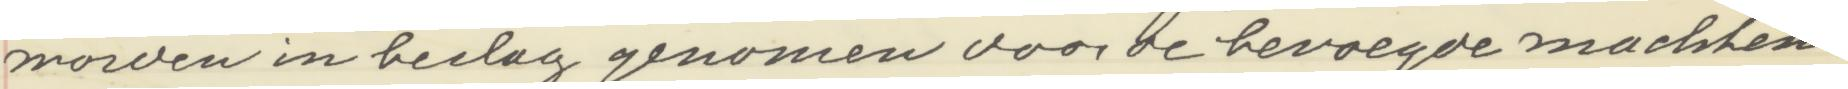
worden in beslag genomen door de bevoegde machten
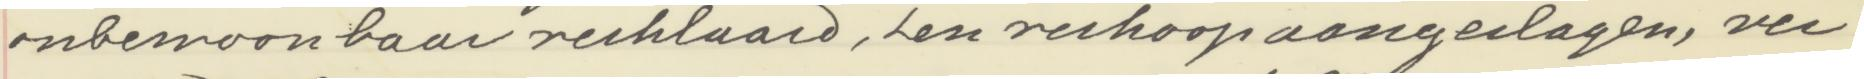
onbewoonbaar verklaard, ten verkoop aangeslagen, ver
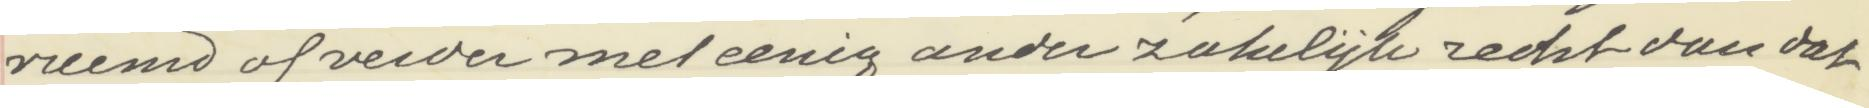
vreemd of verder met eenig ander zakelijk recht dan dat
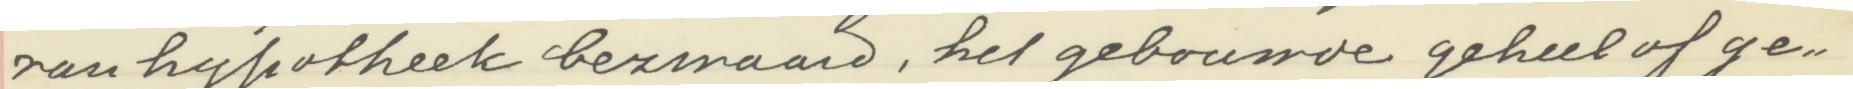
van hypotheek bezwaard, het gebouwde geheel of ge„
